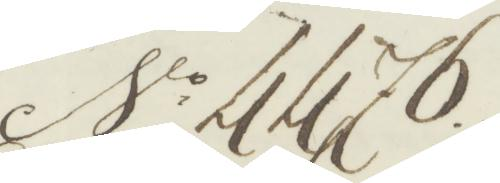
N:o 4476.
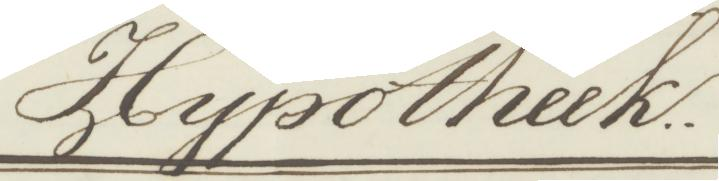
Hypotheek..
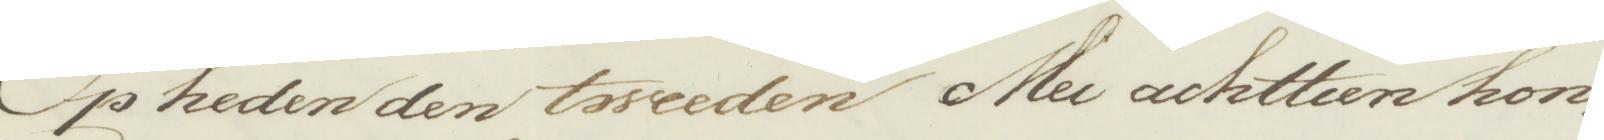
Op heden den tweeden Mei achttien hon,
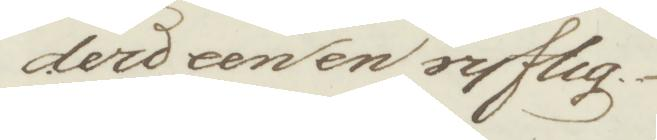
derd een en vyftig.
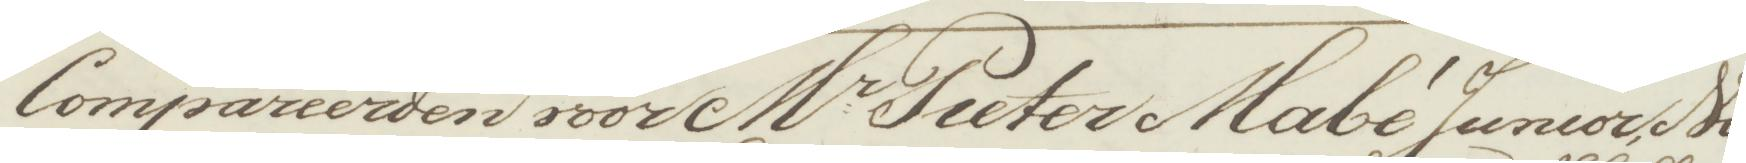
Compareerden voor M:r Pieter Mabé Junior, No
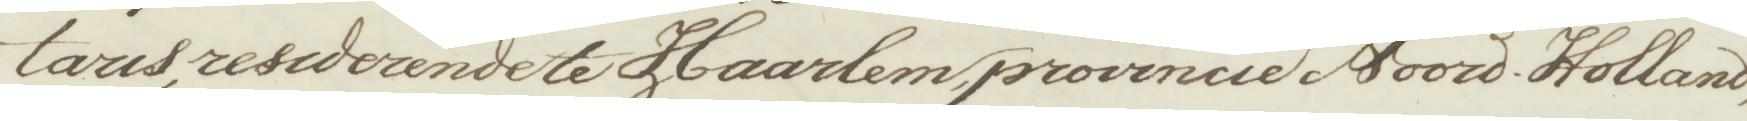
taris, residerende te Haarlem, provincie Noord-Holland
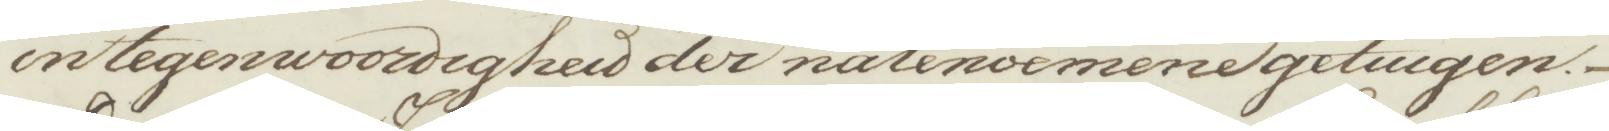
in tegenwoordigheid der natenoemene getuigen.-
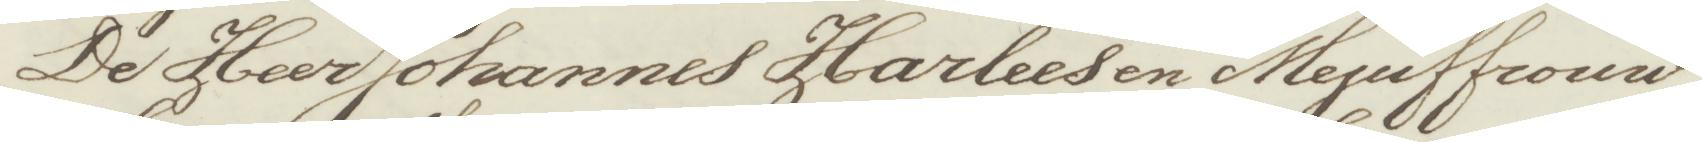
De Heer Johannes Harlees en Mejuffrouw
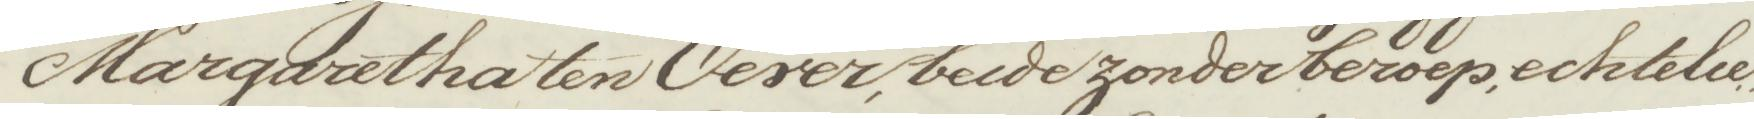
Margaretha ten Oever, beide zonder beroep, echtelie„
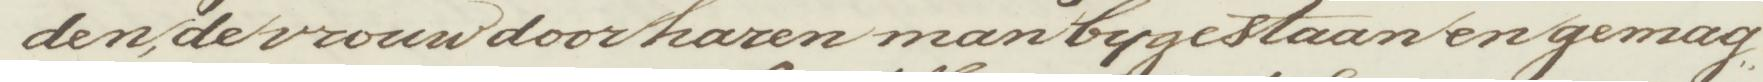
den, de vrouw door haren man bygestaan en gemag
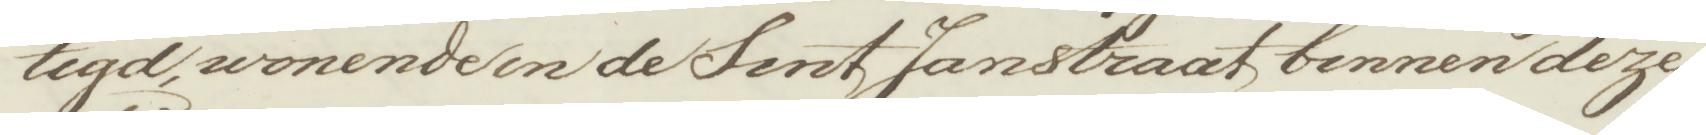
tigd, wonende in de Sint Janstraat, binnen deze
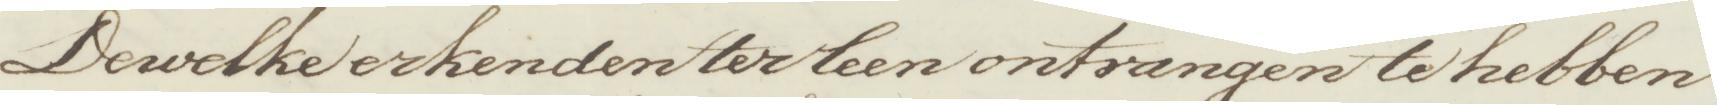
Dewelke erkenden ter leen ontvangen te hebben
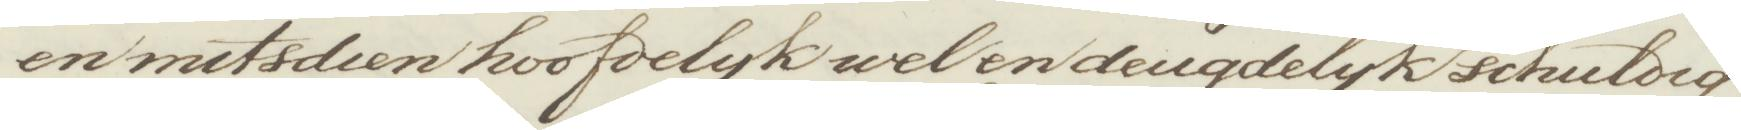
en mitsdien hoofdelyk wel en deugdelyk schuldig
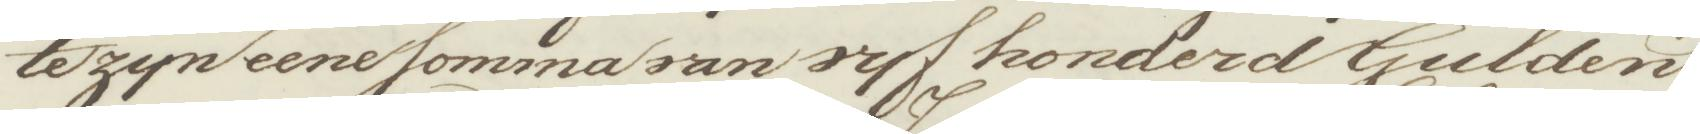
te zyn eene somma van vyf honderd Gulden
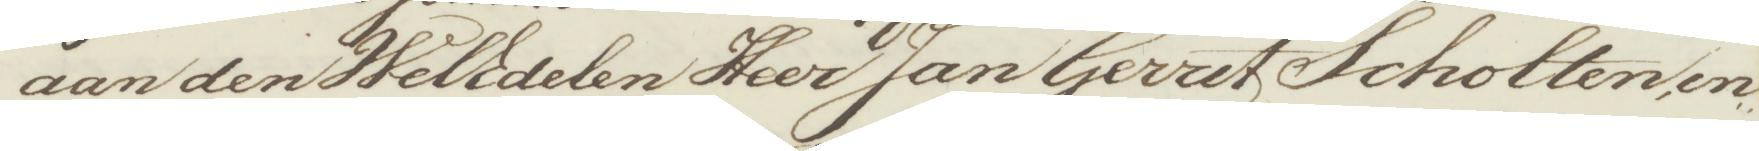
aan den WelEdelen Heer Jan Gerrit Scholten, in„
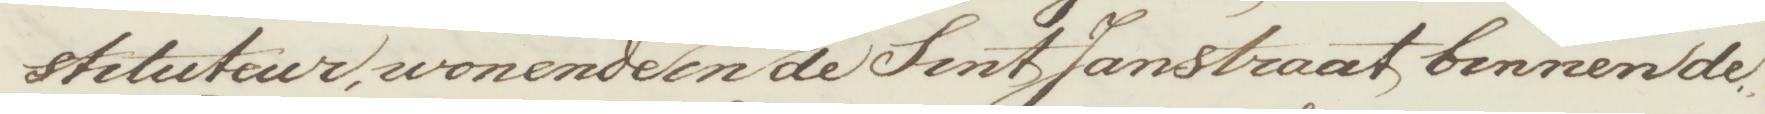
stituteur, wonende in de Sint Janstraat, binnen de„
